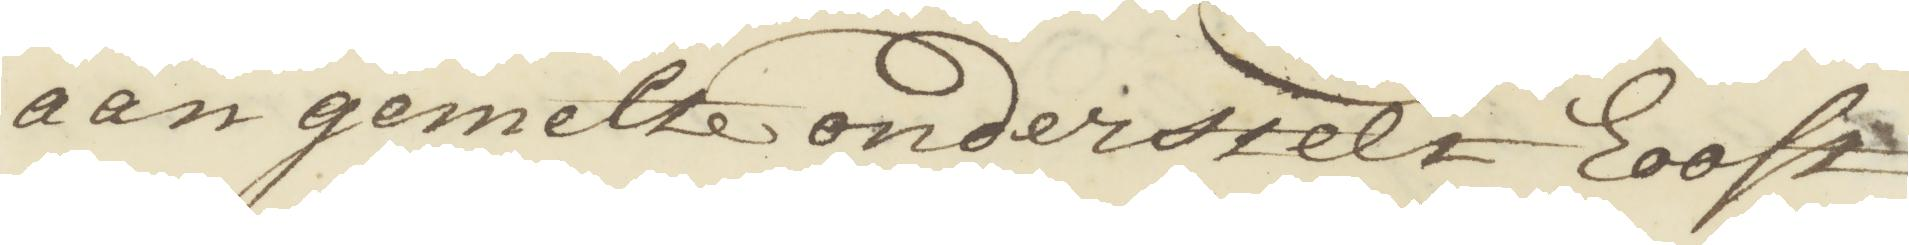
aan gemelte onderstelt hooft
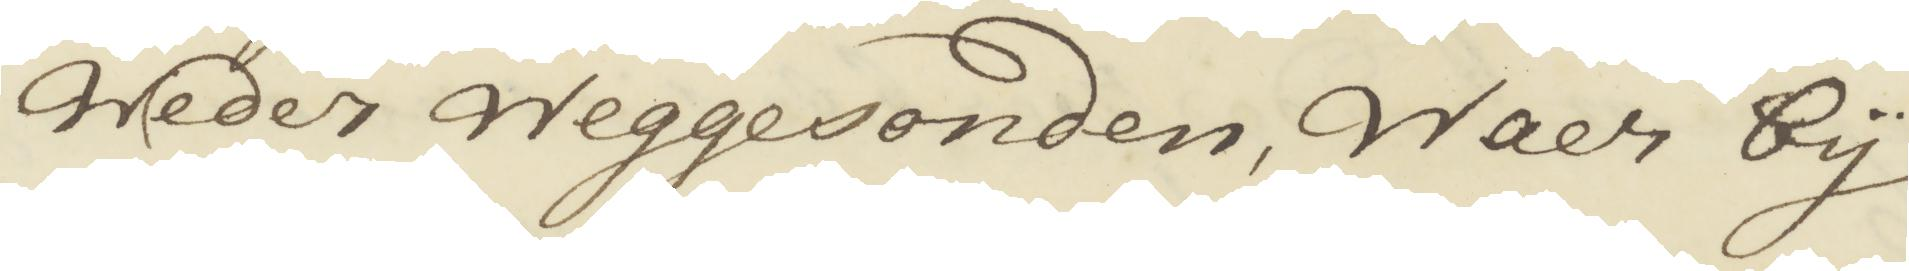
Weder Weggesonden, Waer bij
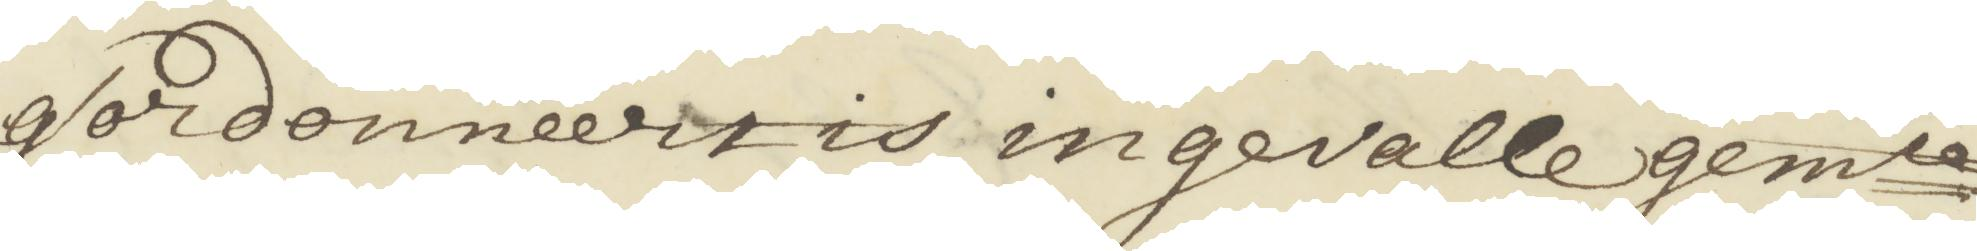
g'ordonneert is, ingevalle gem=te
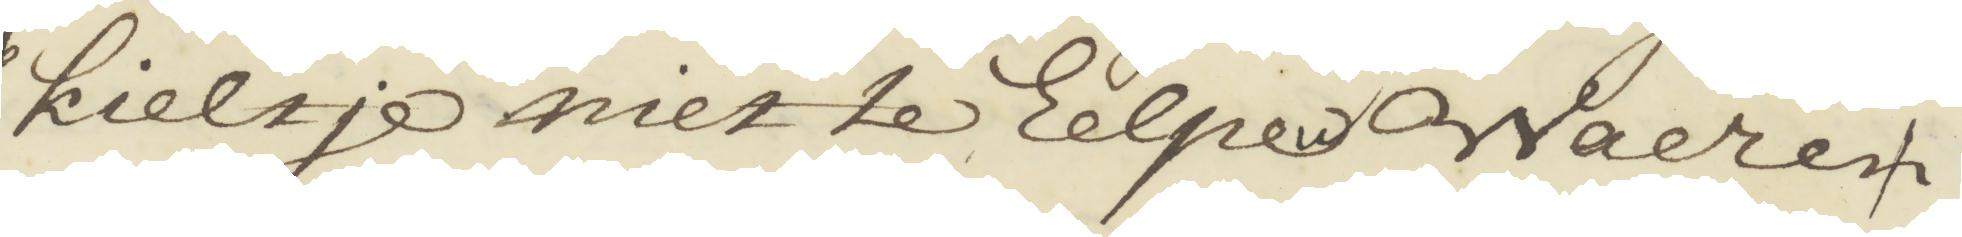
kieltje niet te helpen Waeren
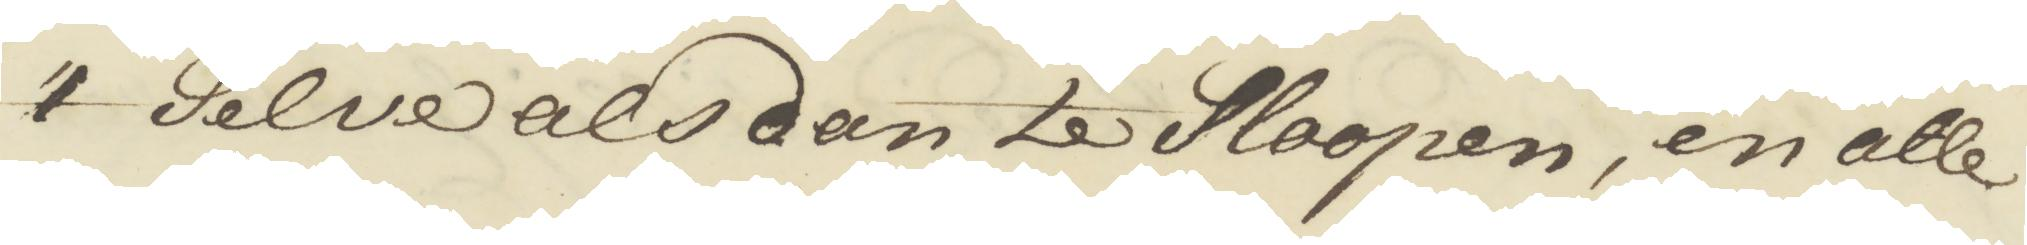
’t Selve als dan te Sloopen, en alle
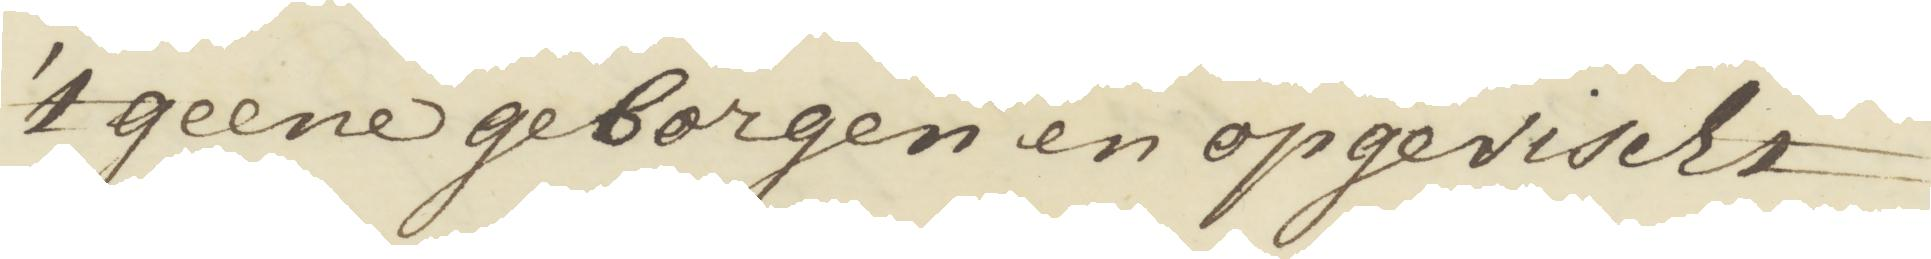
’t geene geborgen en op gevischt
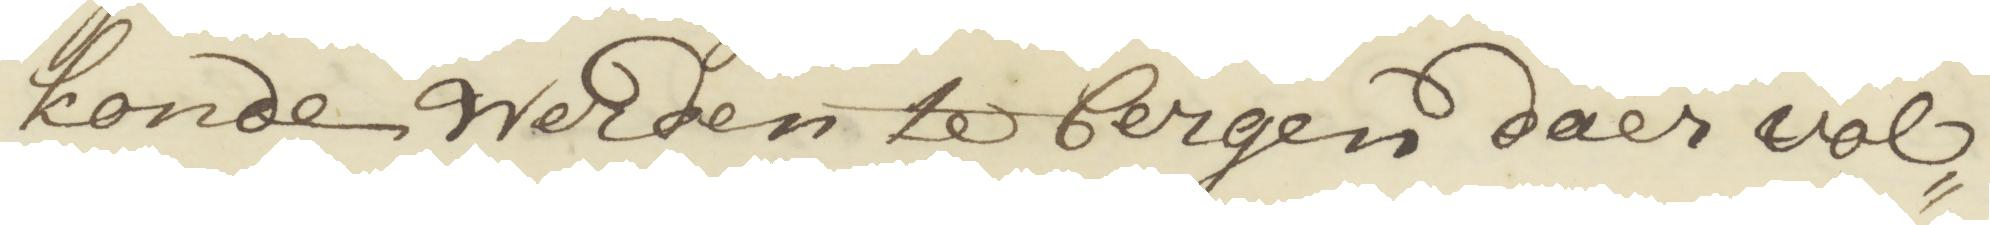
konde Werden te bergen daer vol„
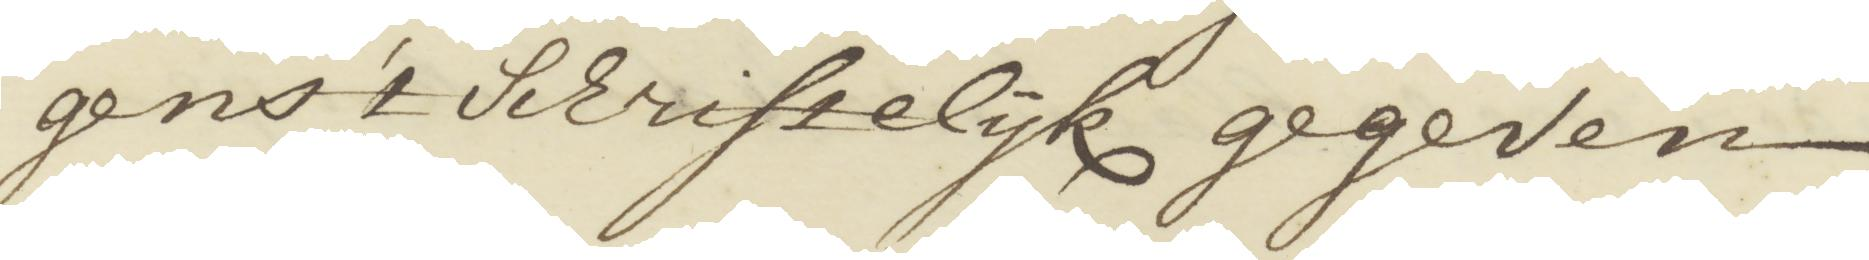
gens ’t Schriftelijk gegeven
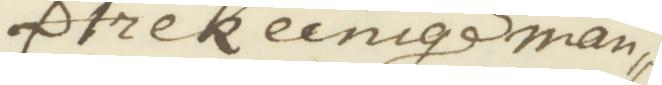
vertrek eenige man„
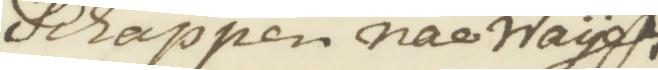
schappen nae Waijer
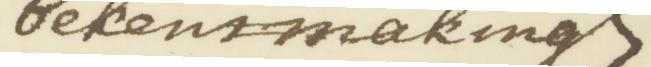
bekentmakingh
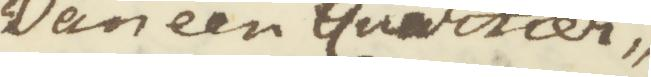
van een Quartier,
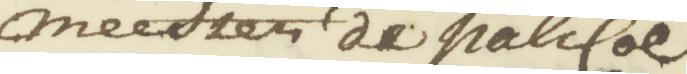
meester de palicol
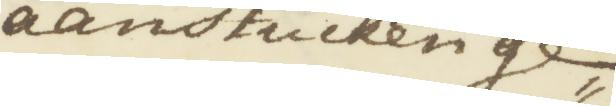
aanstucken ge„
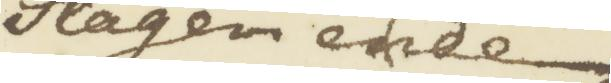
Slagen ende
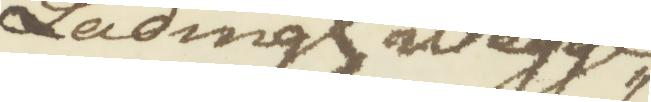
Ladingh wegge„
